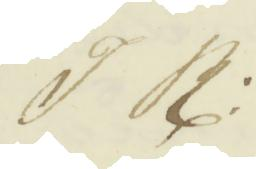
I R:
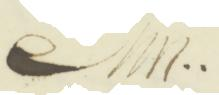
MN..
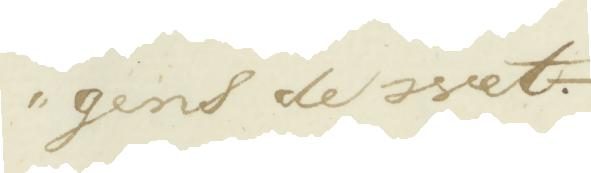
„gens de wet.
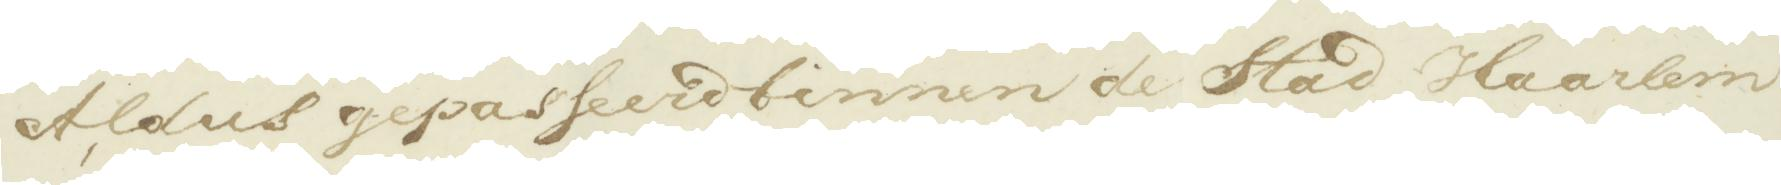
Aldus gepasseerd binnen de Stad Haarlem
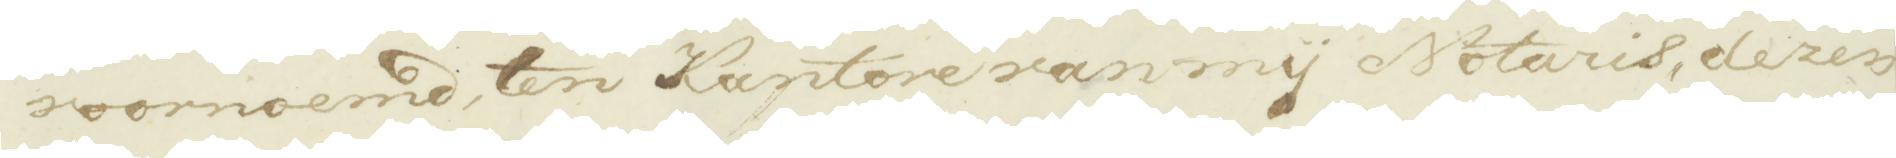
voornoemd, ten Kantore van mij Notaris, dezen
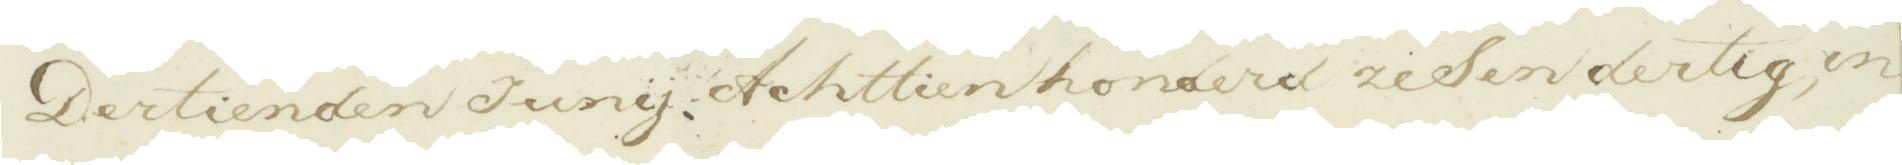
Dertienden Iunij: Achttien honderd zes en dertig, in
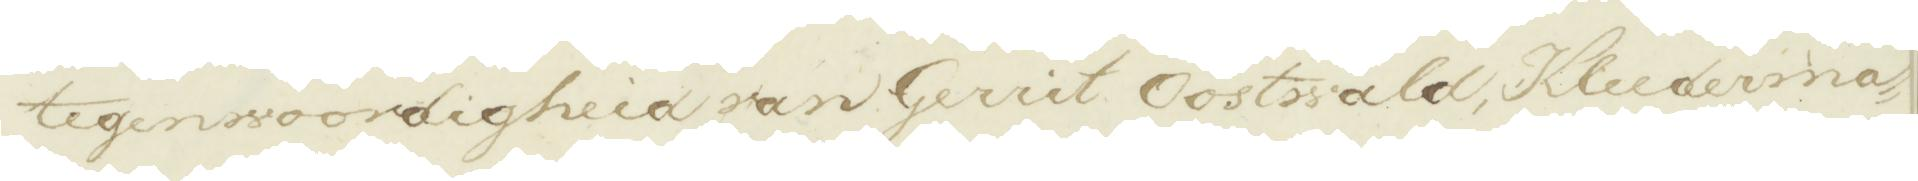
tegenwoordigheid van Gerrit Oostwald, Kleederma„
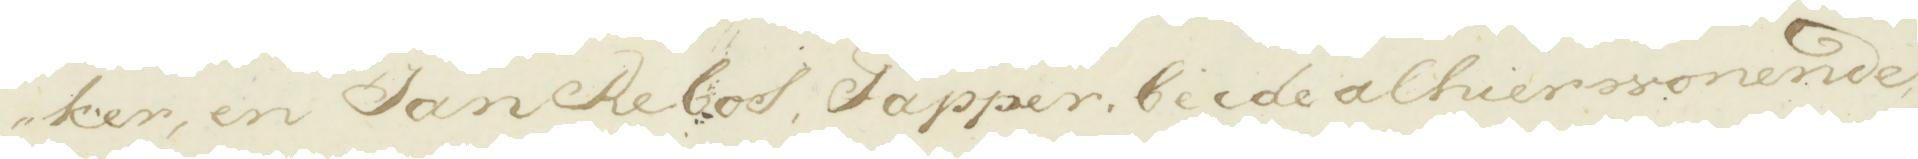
„ker, en Jan Rebos, Tapper, beide alhier wonende,
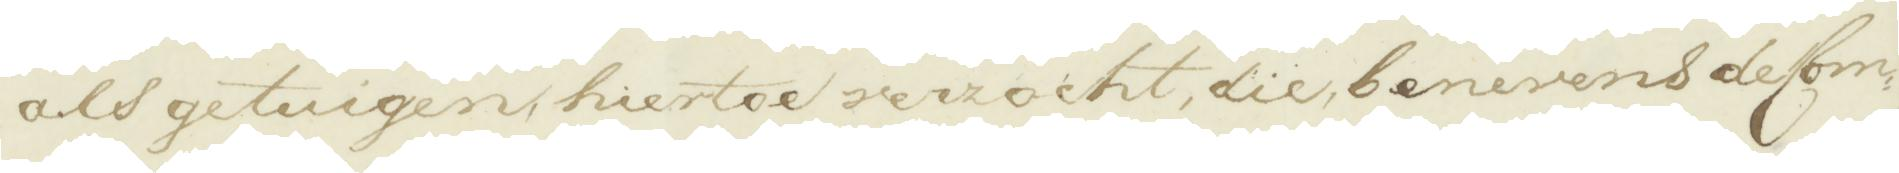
als getuigen, hiertoe verzocht, die, benevens de Com
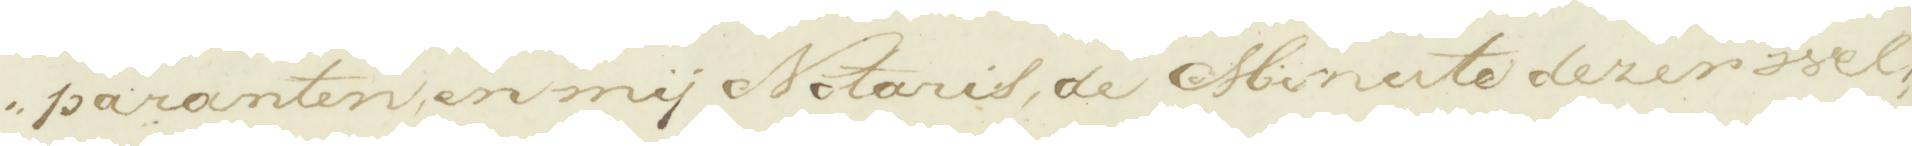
„paranten, en mij Notaris, de Minute dezer wel
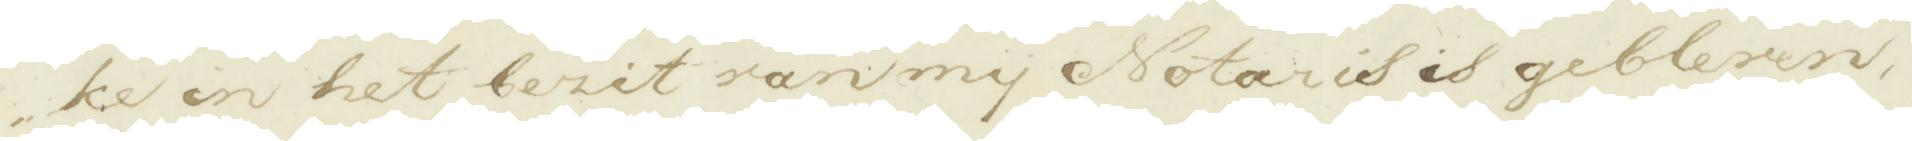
„ke in het bezit van mij Notaris is gebleven,
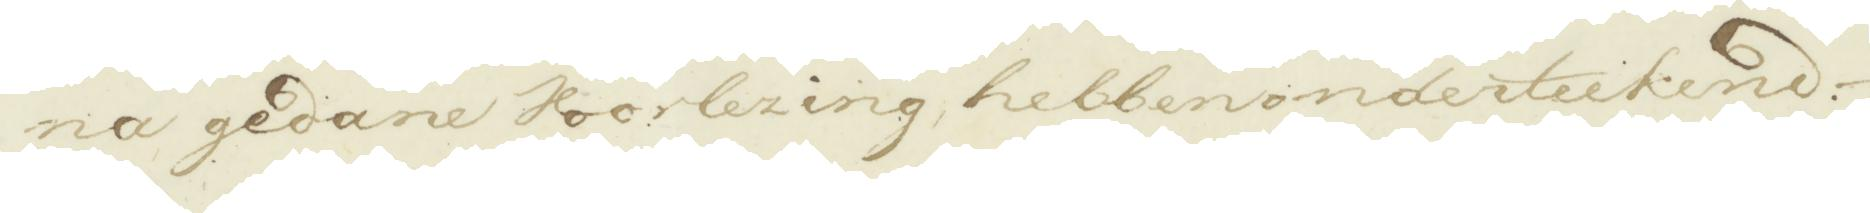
na gedane voorlezing, hebben onderteekend:
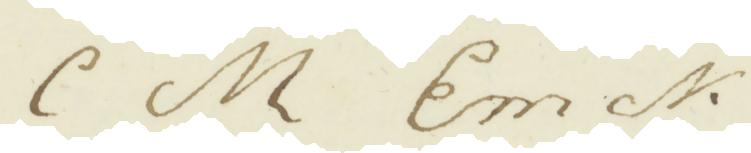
C M Em N.
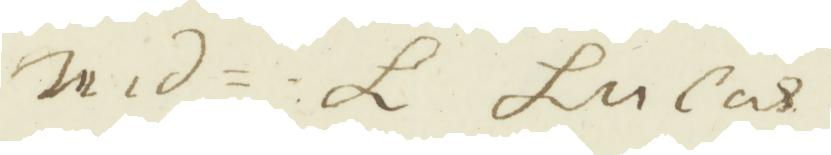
Mid=: L Lucas
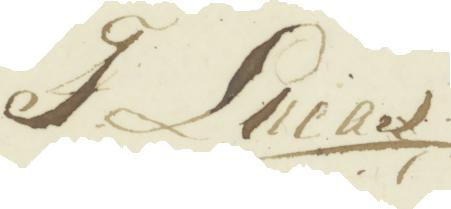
I: Lucas.
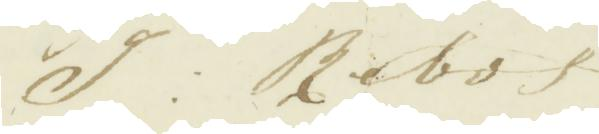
I: Rebos
